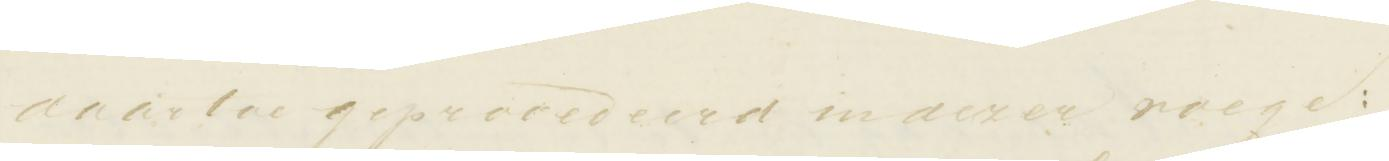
daartoe geprocedeerd in dezer voege:
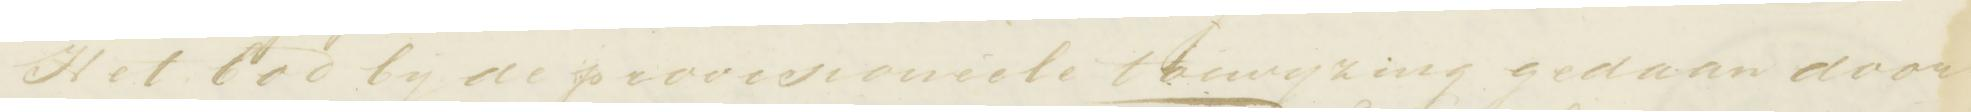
Het bod bij de provisioneele toewijzing gedaan door
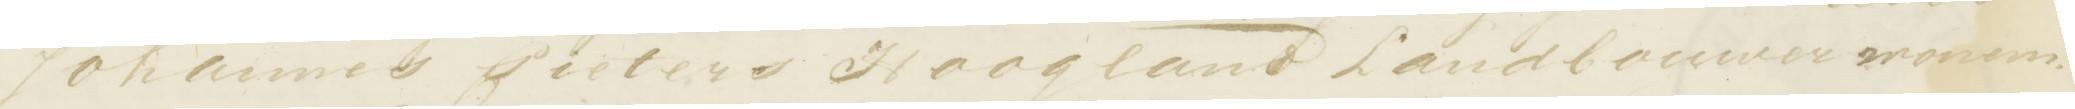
Johannes Pieters Hoogland Landbouwer wonen
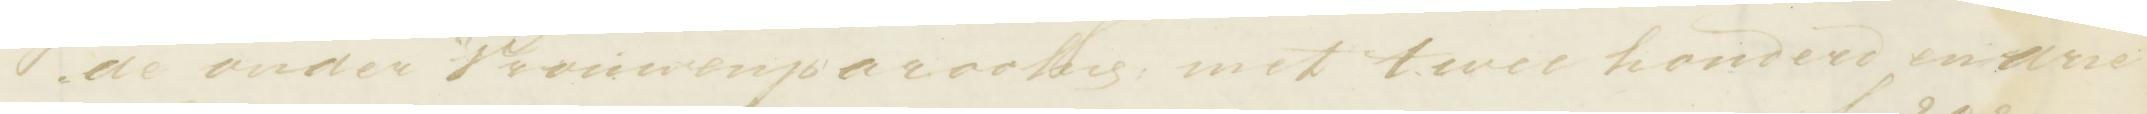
=de onder Vrouwenparochie: met twee honderd en drie
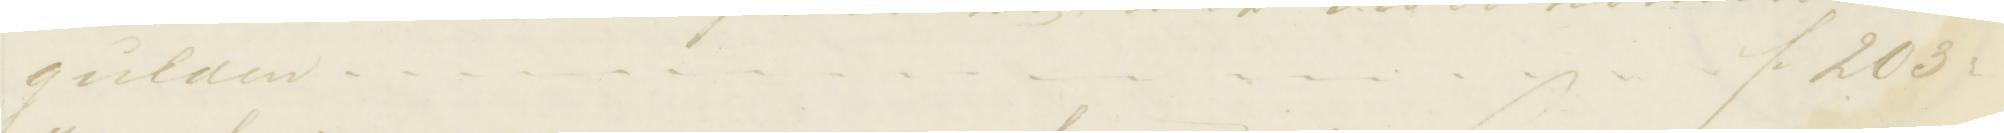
gulden - - - - - - - - - - - - - - - - ƒ 203:
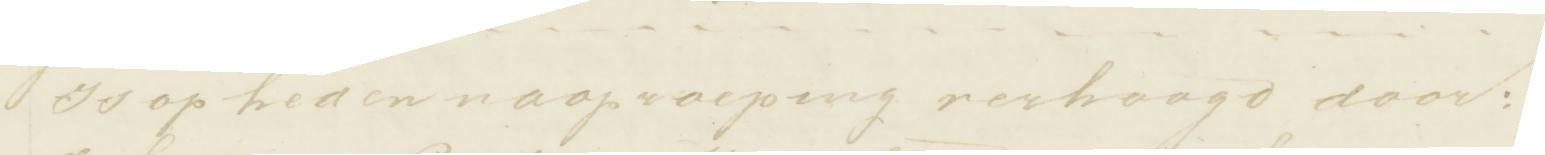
Is op heden na oproeping verhoogd door:
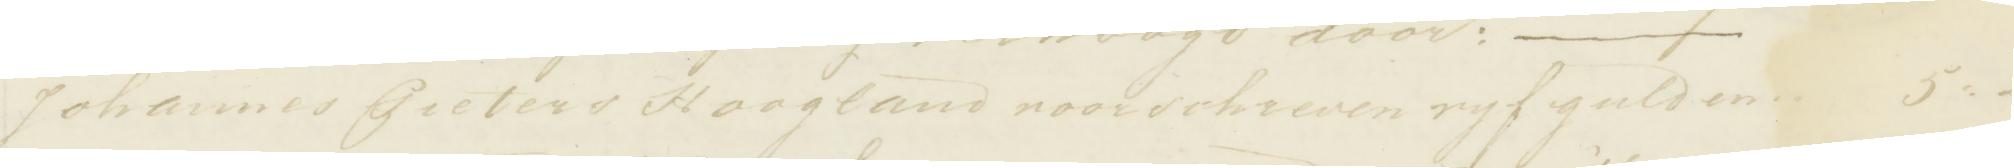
Johannes Pieters Hoogland voorschreven vyf gulden . . 5:
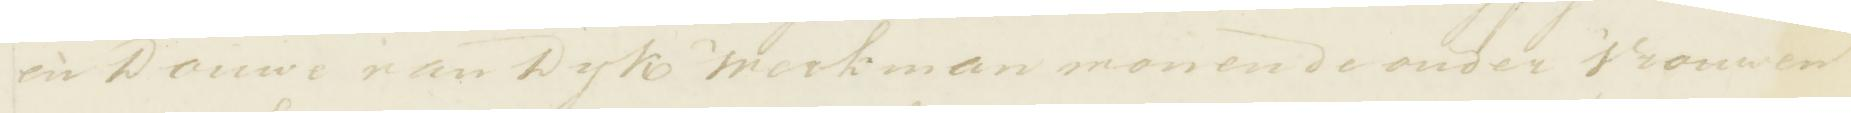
en Douwe van Dijk werkman wonende onder Vrouwen
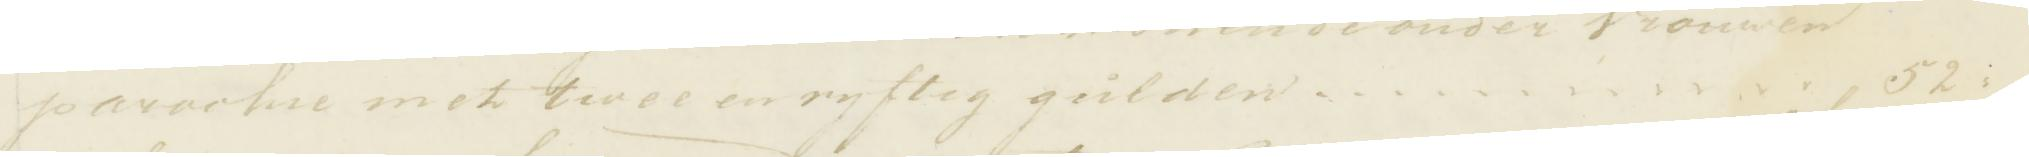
parochie met twee en vijftig gulden . . . . . . . . . . . . . 52:
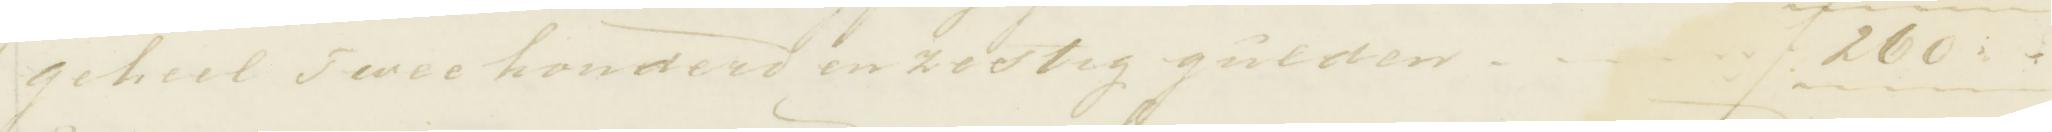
geheel Twee honderd en zestig gulden - - - - - - ƒ260: -
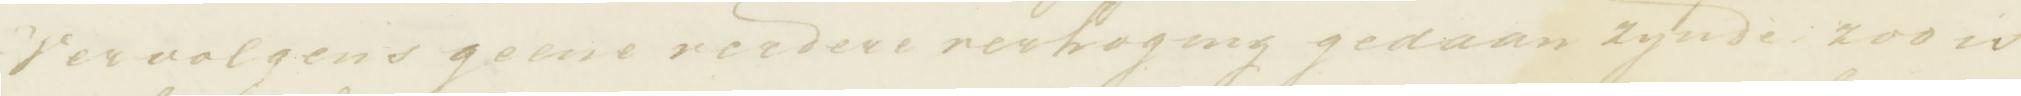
vervolgens geene verdere verhoging gedaan zijnde zoo is
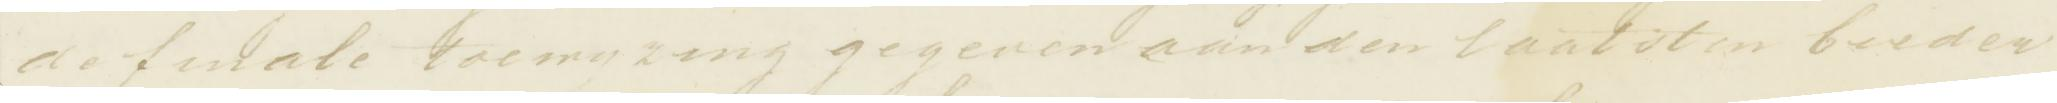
de finale toewijzing gegeven aan den laatsten boeder
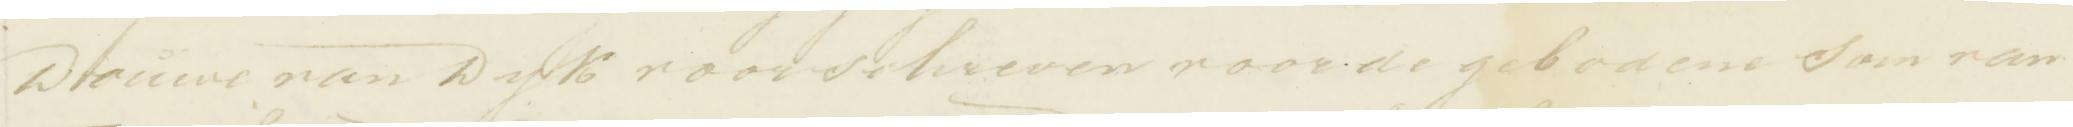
Bouwe van Dyk voorschreven voor de gebodene som van
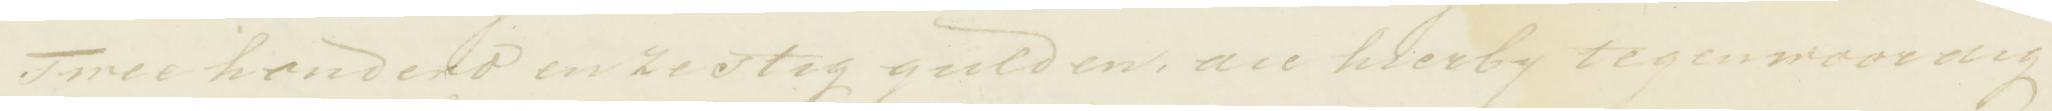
Twee honderd en zestig gulden, die hierbij tegenwoordig
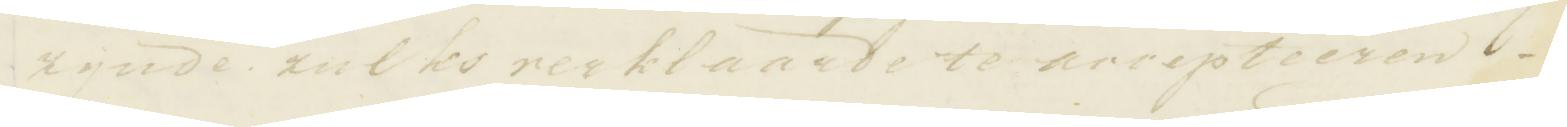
zijnde zulks verklaarde te accepteeren -
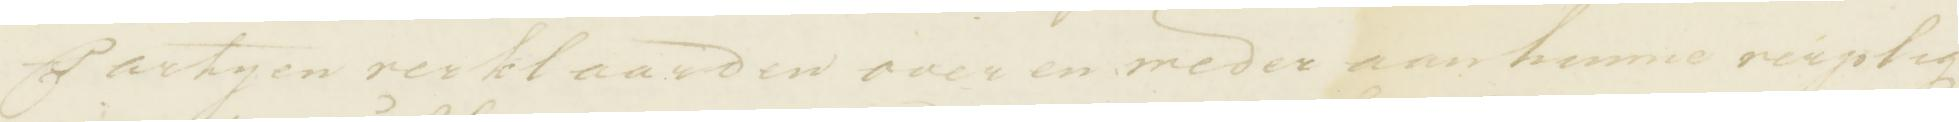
Partijen verklaarden over en weder aan hunne verplig
